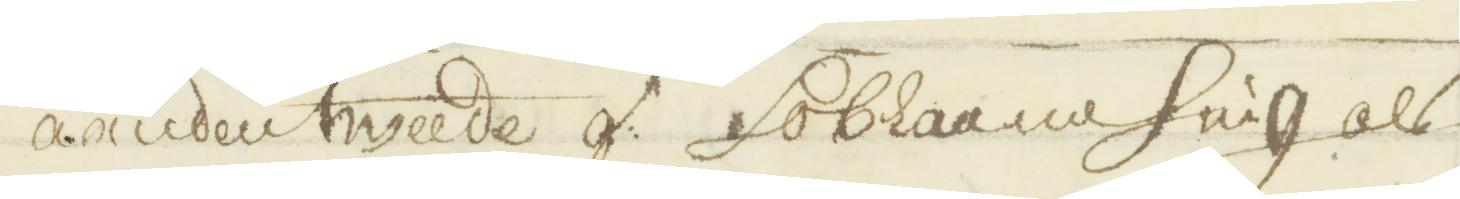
aan den tweede g:t sobhamesnig als
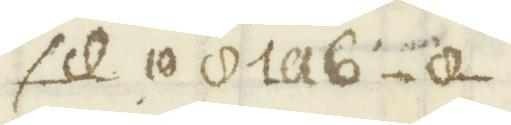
ƒ8 1046' – 8–
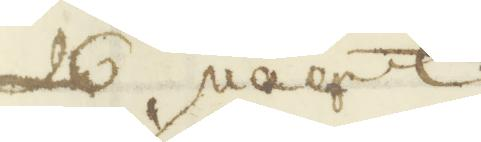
26 nagel
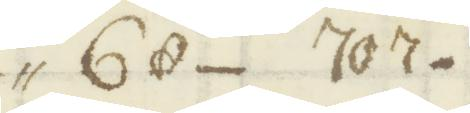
„ 68 — 707–
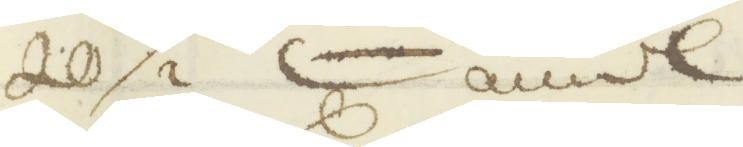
20½ Caneel
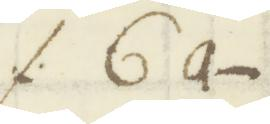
ƒ 64–
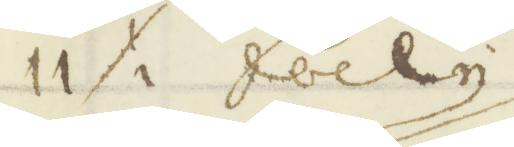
11½ foelij
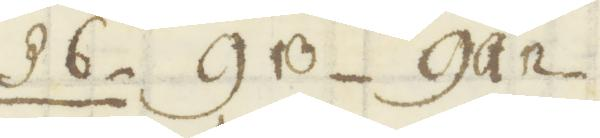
36– 9 10– 9412–
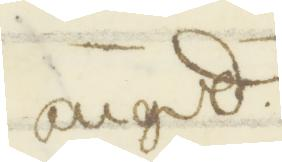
onged.
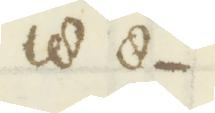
18 8–
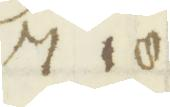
7 18
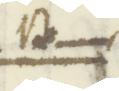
5. 12 –
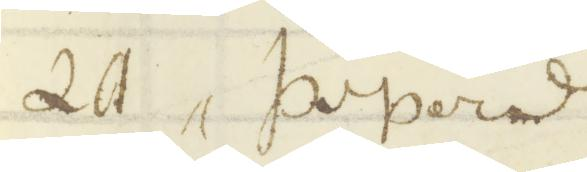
24 „ pepere
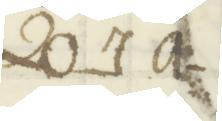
20 7 4-
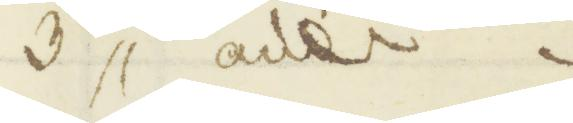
3 „ ande
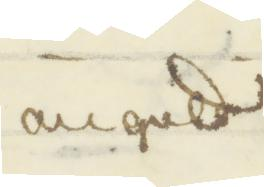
anged
